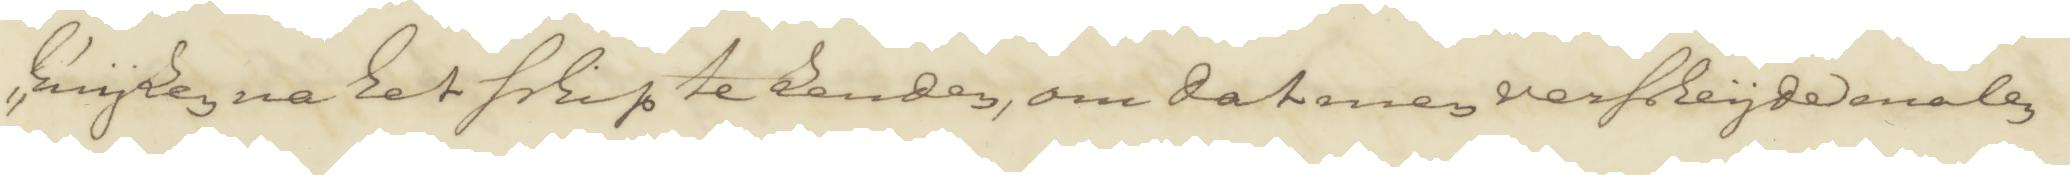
„huijzen na het schip te zenden, om dat men verscheijde malen
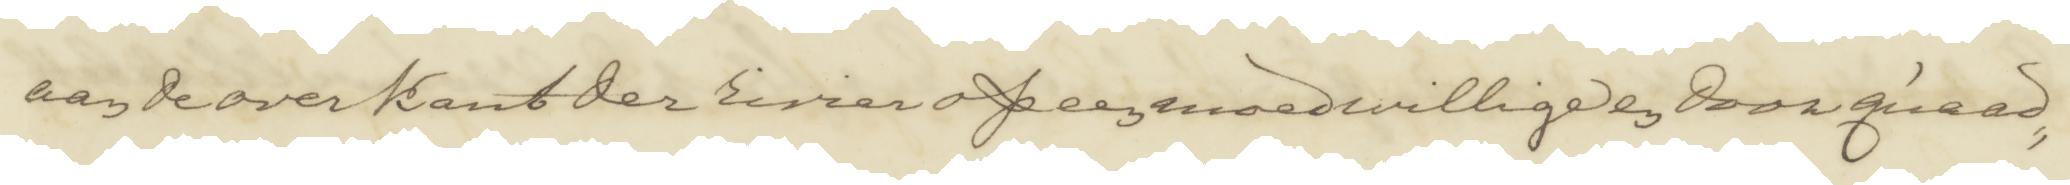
aan de overkant der rivier op een moedwillige en door quaad„
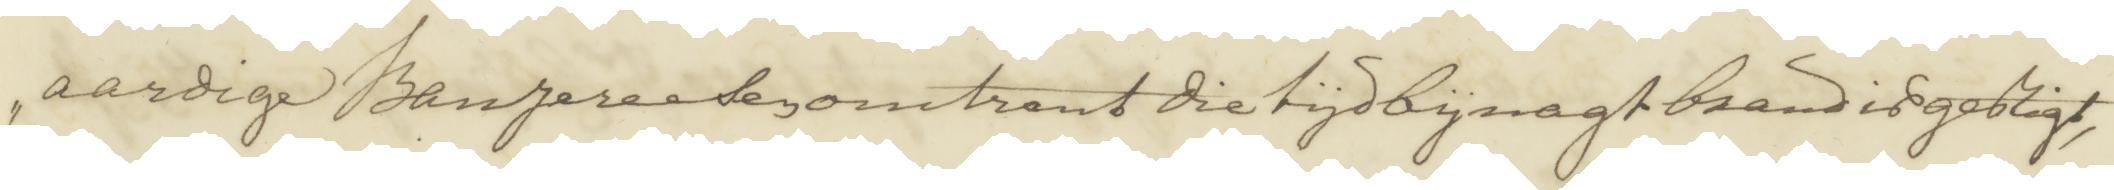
„aardige Banjereesen omtrent die tijd bij nagt brand is gestigt,
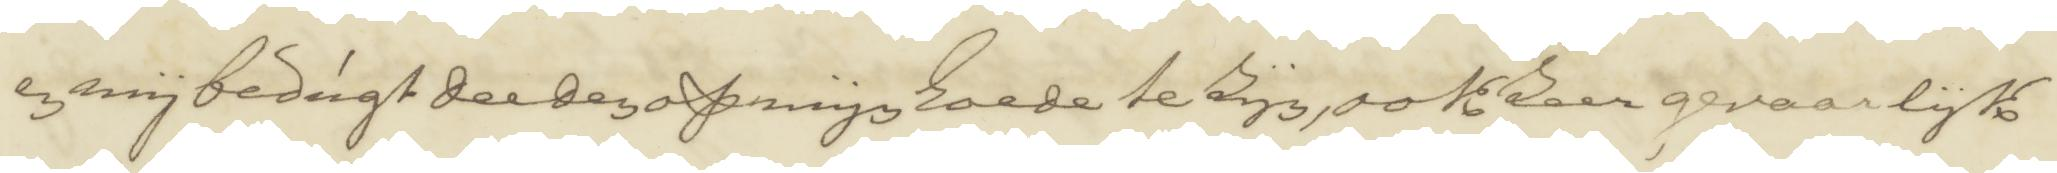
en mij bedugt deeden op mijn hoede te zijn, ook zeer gevaarlijk
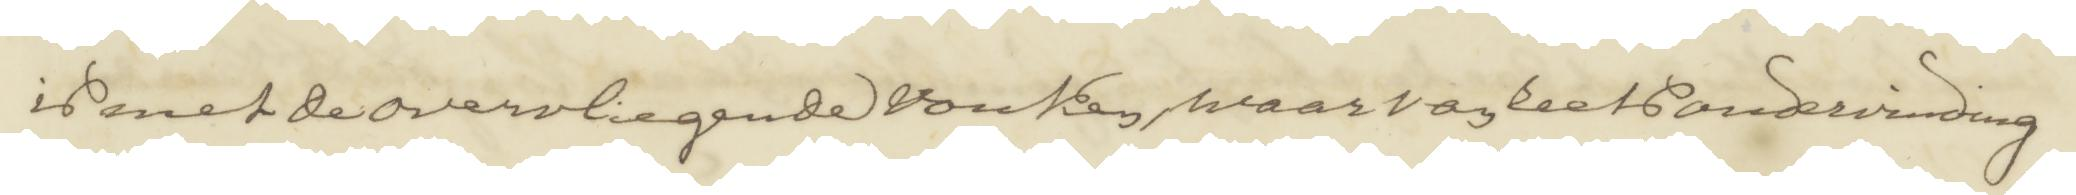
is met de overvliegende vonken, waar van reets ondervinding
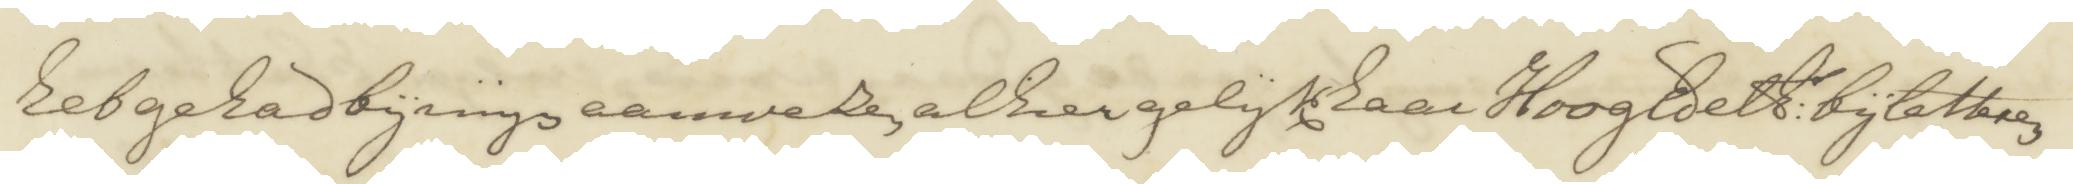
heb gehad bij mijn aanwezen alhier gelijk haar Hoog Edelh:s bij letteren
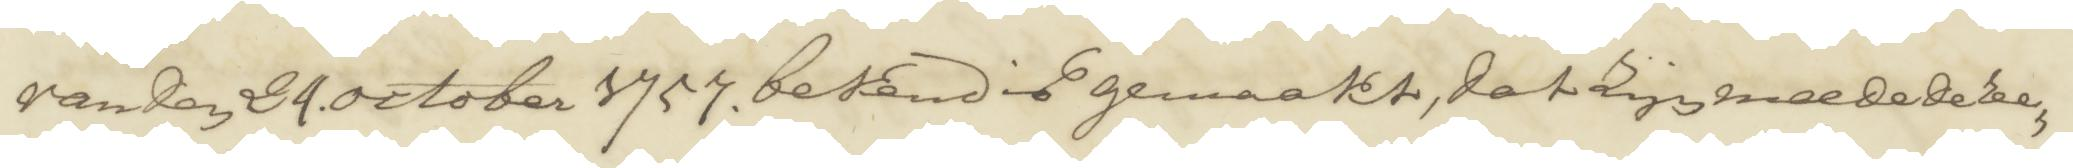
van den 24. october 1757. bekend is gemaakt, dat zijn meede de ree„
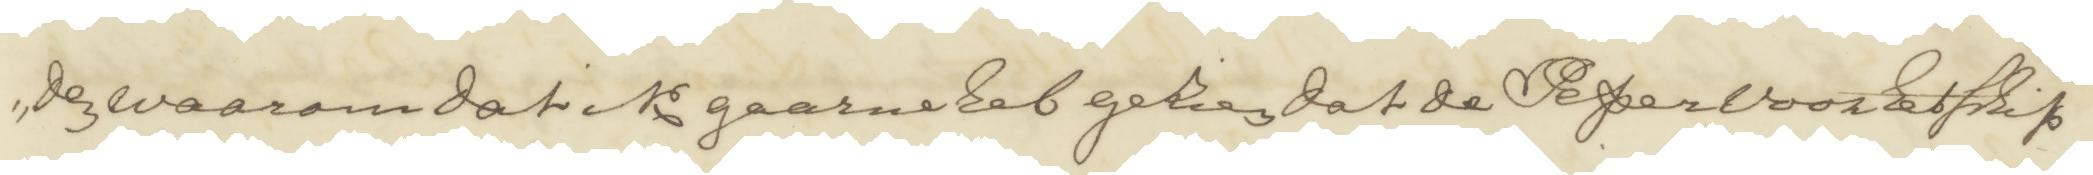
„den waarom dat ik gaarne heb gezien dat de Peper voor het schip
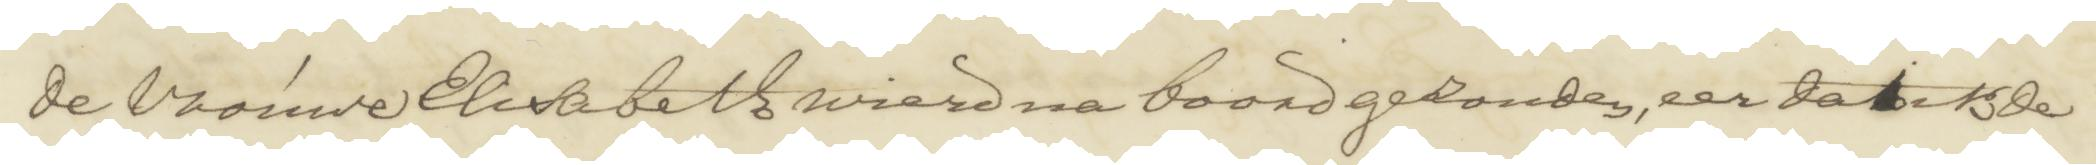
de vrouwe Elisabeth wierd na boord gezonden, eer dat ik de
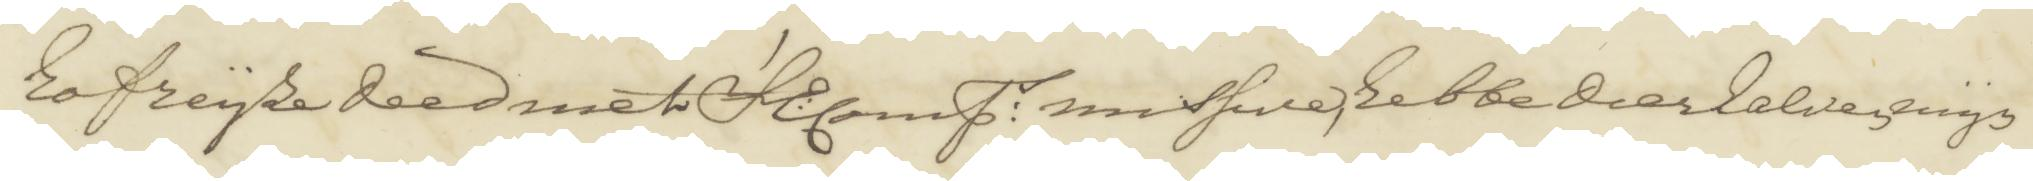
hofreijze deed met 'SE:Comp:s missive, hebbe dierzelven mijn
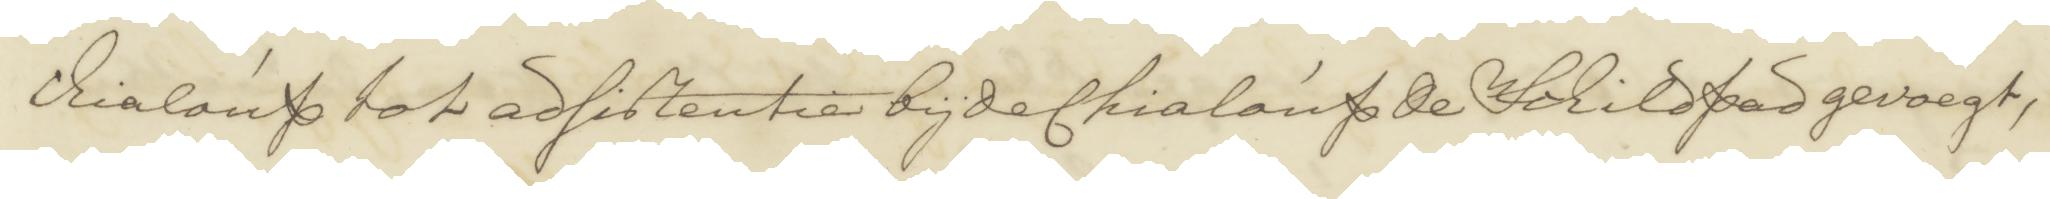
Chialoup tot adsistentie bij de Chialoup de schildpad gevoegt,
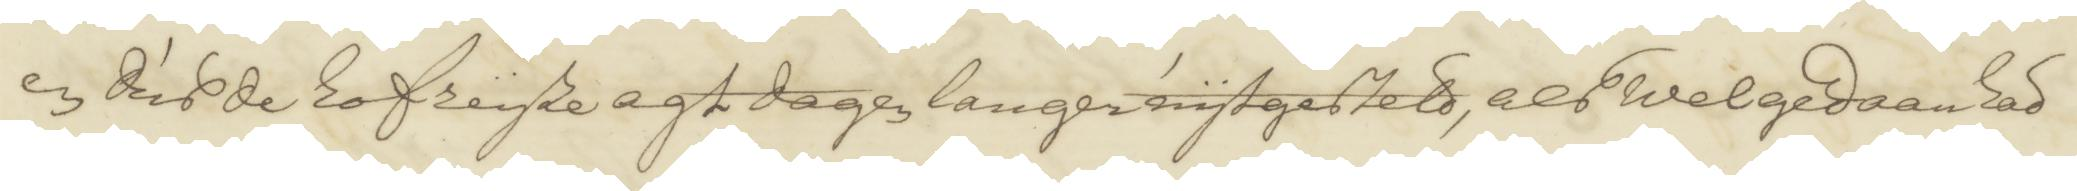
en dus de hofreijze agt dagen langer uijtgesteld, als wel gedaan had
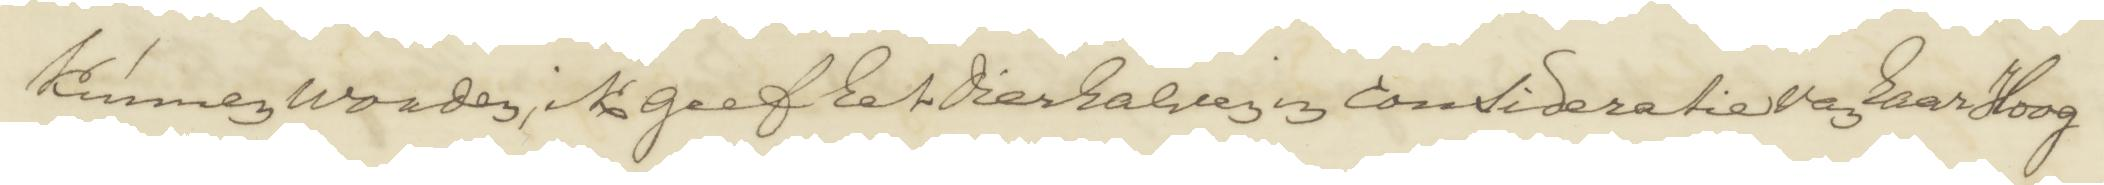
kunnen worden, ik geef het dierhalven in consideratie van haar Hoog
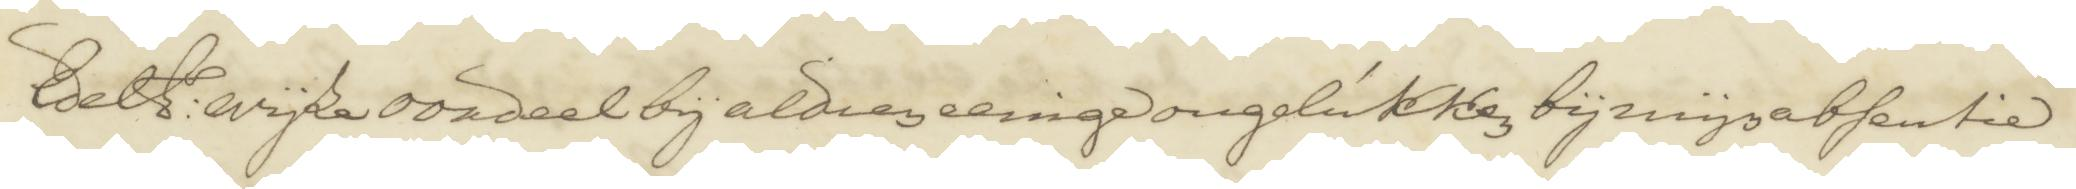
Edelh:s wijze oordeel bij aldien eenige ongelukken bij mijn absentie
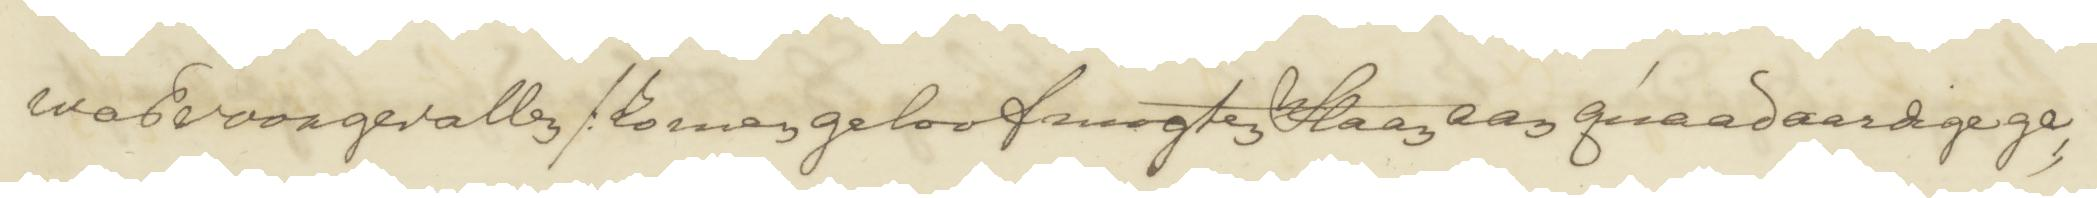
was voorgevallen /: zo men geloof mogten slaan van quaadaardige ge„
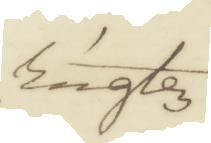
rugten
